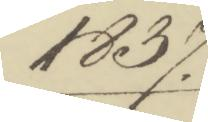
1837
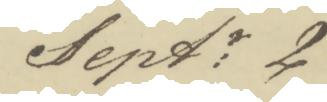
Sept:r 2
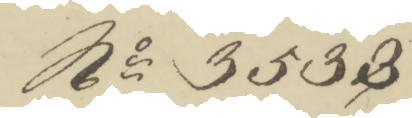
N=o 3533
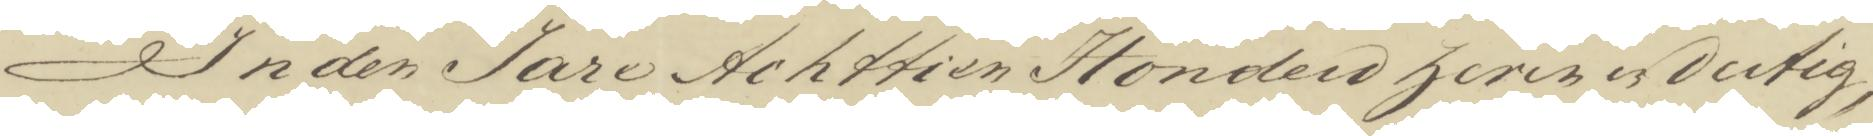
Inden Jare Achttien Honderd Zeven en dertig,
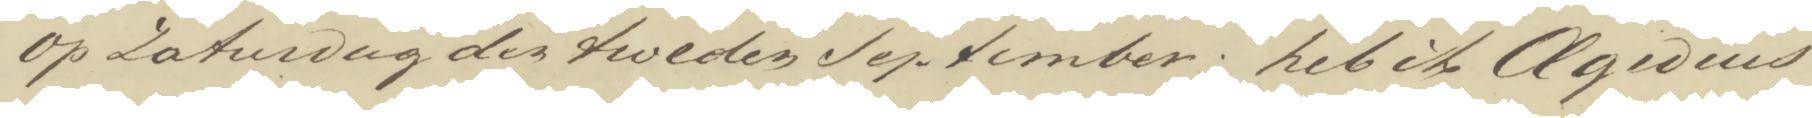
op Zaturdag den tweden September, heb ik AEgidius
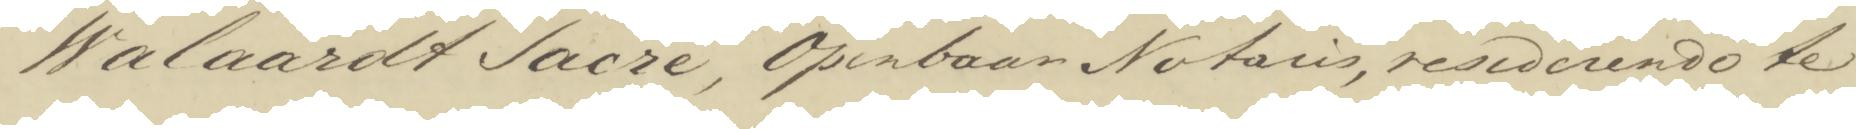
Walaardt Sacré, Openbaar Notaris, residerende te
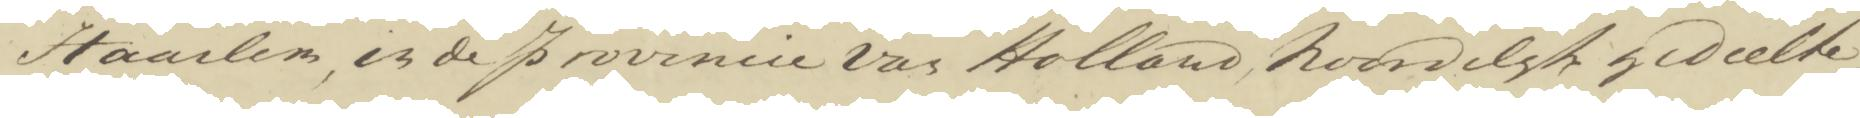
Haarlem, in de provincie van Holland, Noordelyk gedeelte
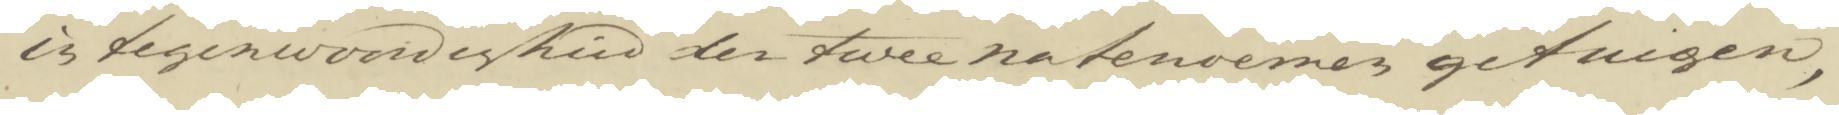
in tegenwoordigheid der twee natenoemen getuigen,
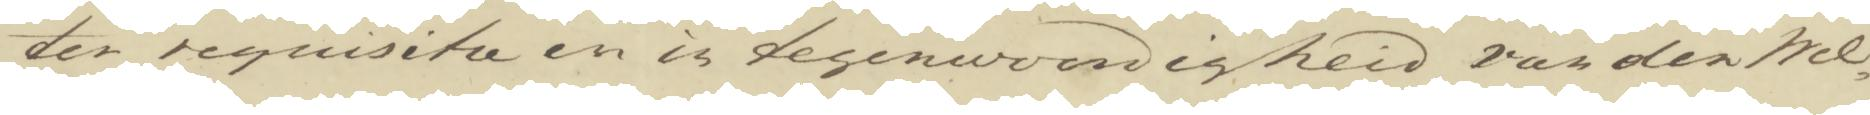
ter requisitie en in tegenwoordigheid van den Wel
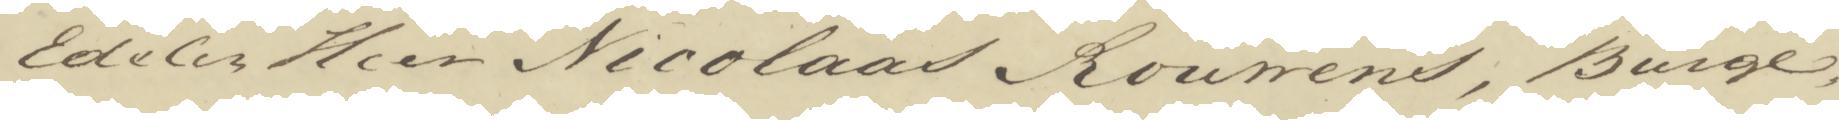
Edelen Heer Nicolaas Rouwens, Burge
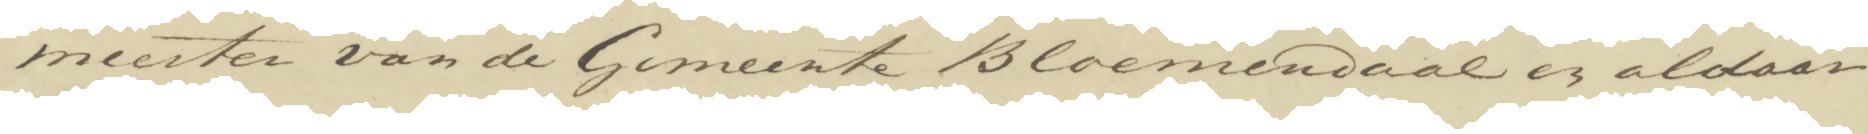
meester van de Gemeente Bloemendaal en aldaar
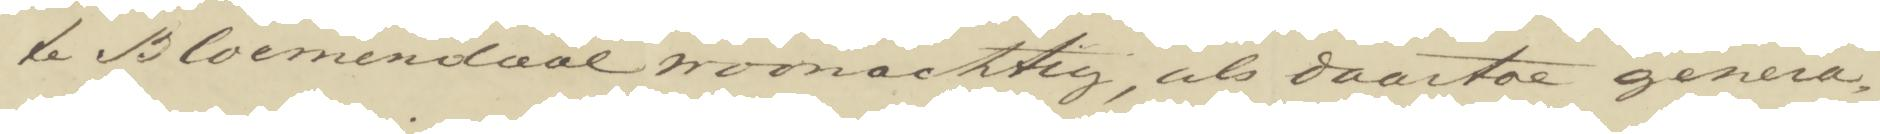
te Bloemendaal woonachtig, als daartoe genera„
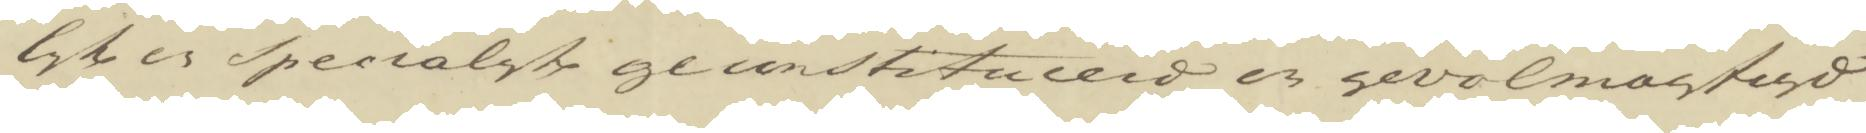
lyk en specialyk geconstitueerd en gevolmagtigd
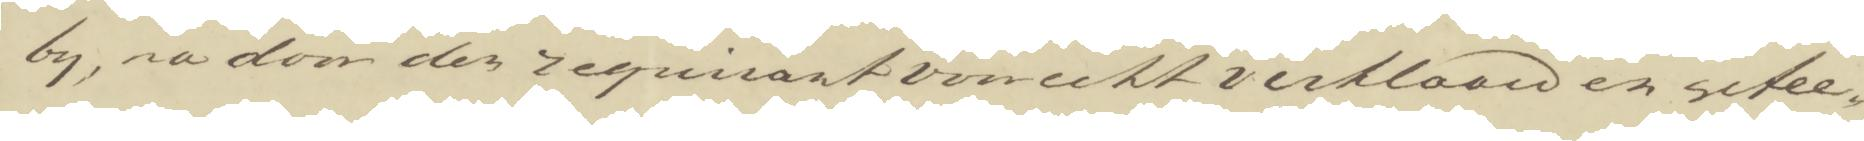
by, na door den requirant voor echt verklaard en getee
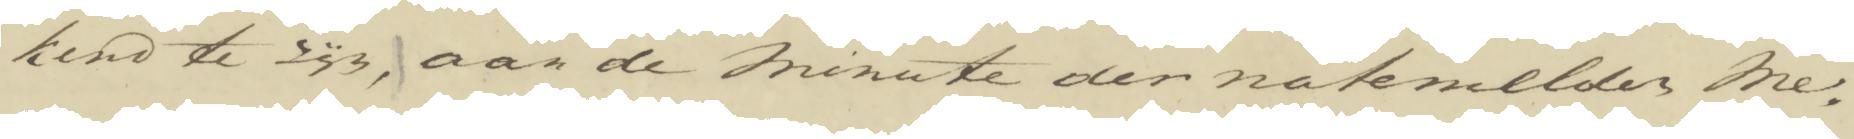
kend te zijn, aan de minute der natemelden me„
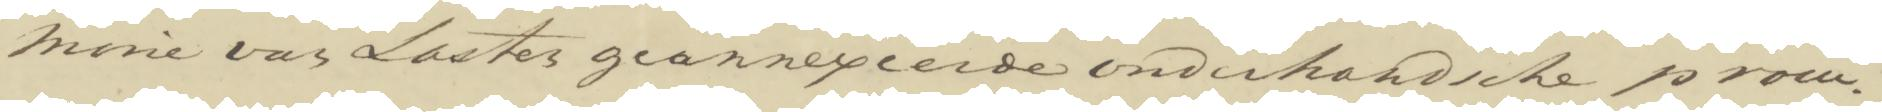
morie van Lasten geannexeerde onderhandsche procu.
